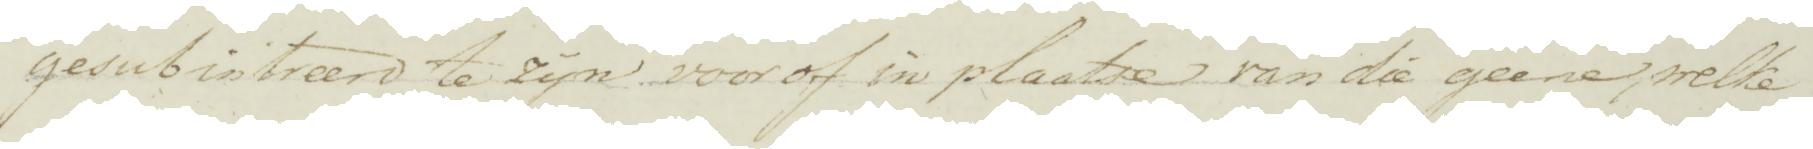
gesubintreerd te zijn voor of in plaatse van die geene welke
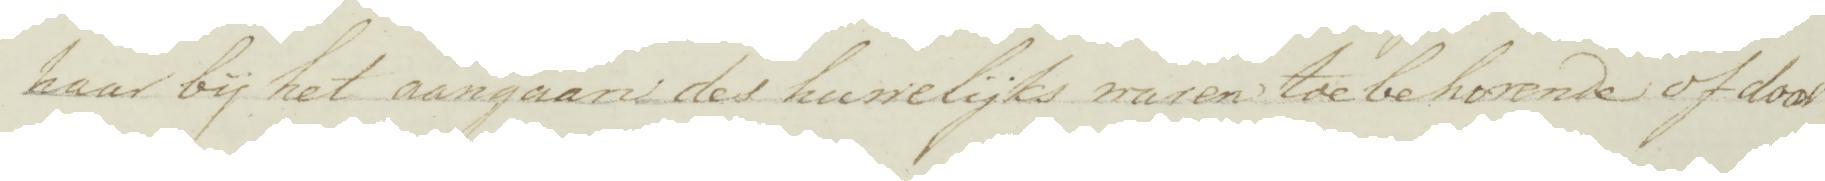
haar bij het aangaan des huwelijks waren toebehorende of door
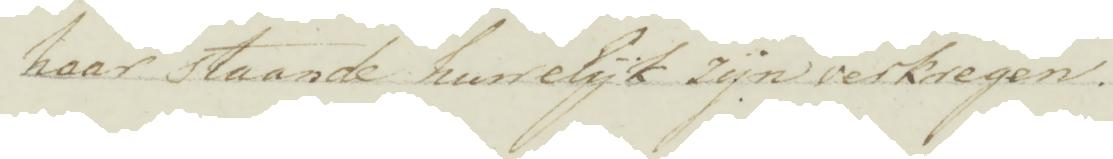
haar staande huwelijk zijn verkregen.
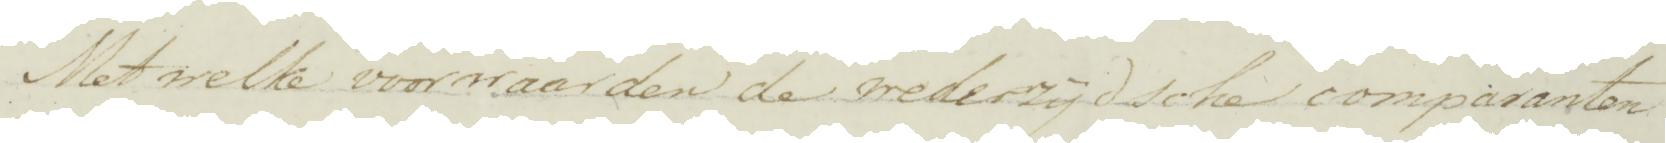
Met welke voorwaarden de wederzijdsche comparanten
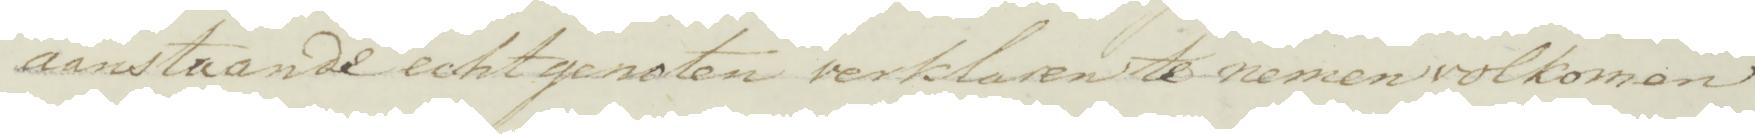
aanstaande echtgenoten verklaren te nemen volkomen
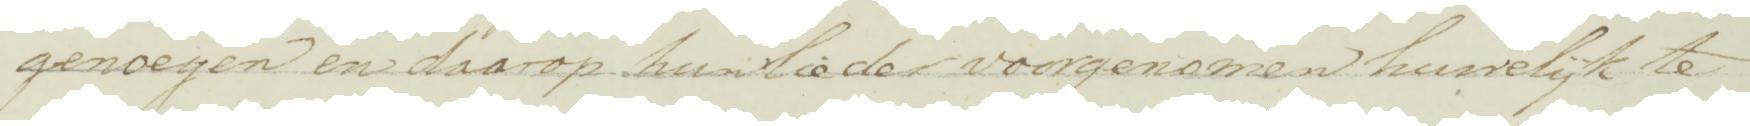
genoegen en daarop hunlieder voorgenomen huwelijk te
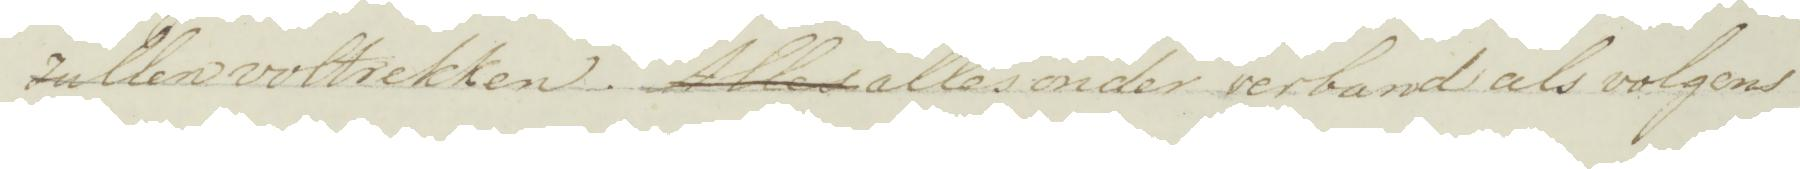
zullen voltrekken XAlles alles onder verband als volgens
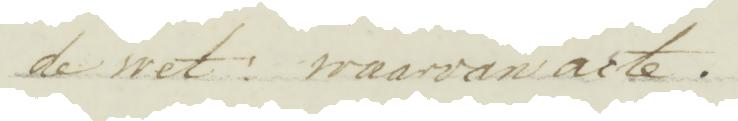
de wet: waarvan acte.
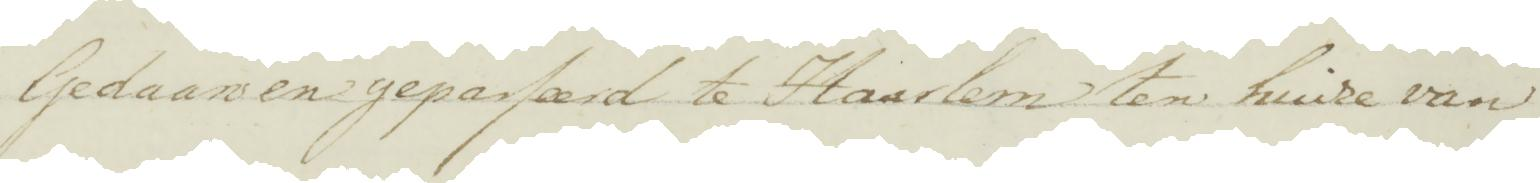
Gedaan en gepasseerd te Haarlem, ten huize van
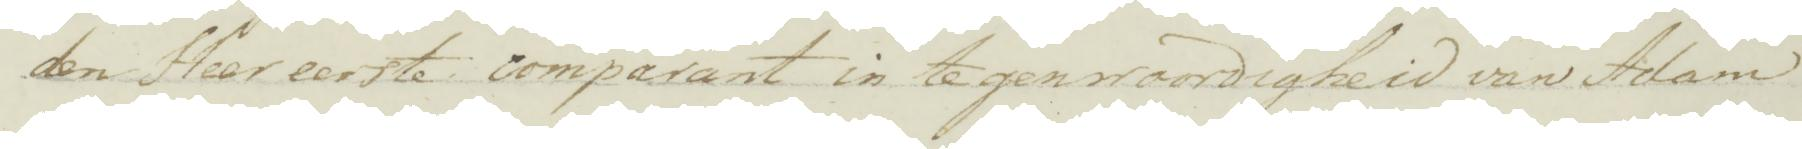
den Heer eerste comparant in tegenwoordigheid van Adam
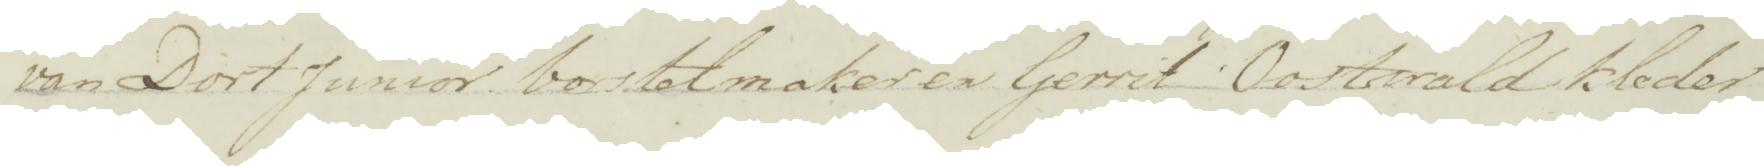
van Dort Junior borstelmaker en Gerrit Oostwald kleder
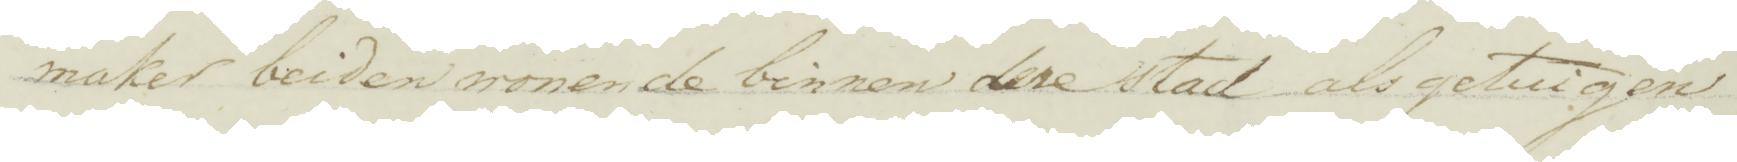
maker beiden wonende binnen deze stad als getuigen
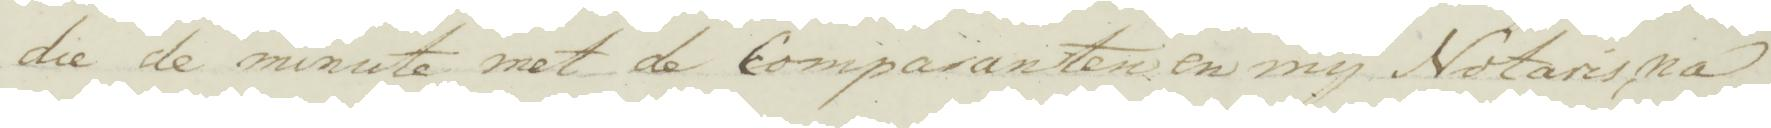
die de minute met de comparanten en mij Notaris na
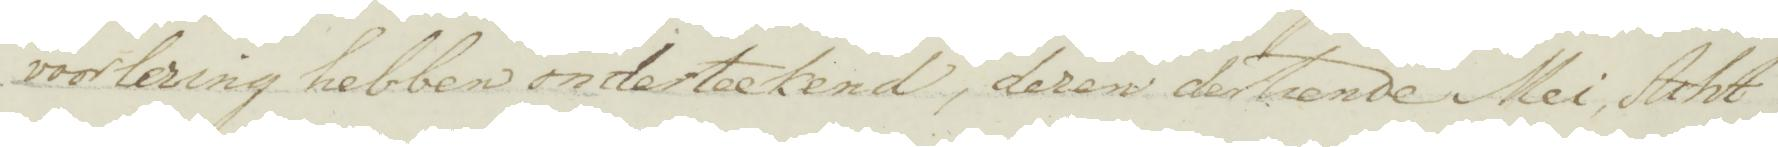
voorlezing hebben onderteekend, dezen dertiende Mei, Acht
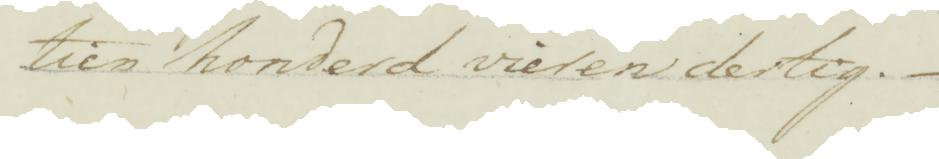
tien honderd vier en dertig.-
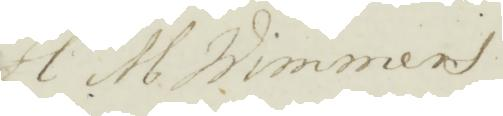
H M Wimmers
